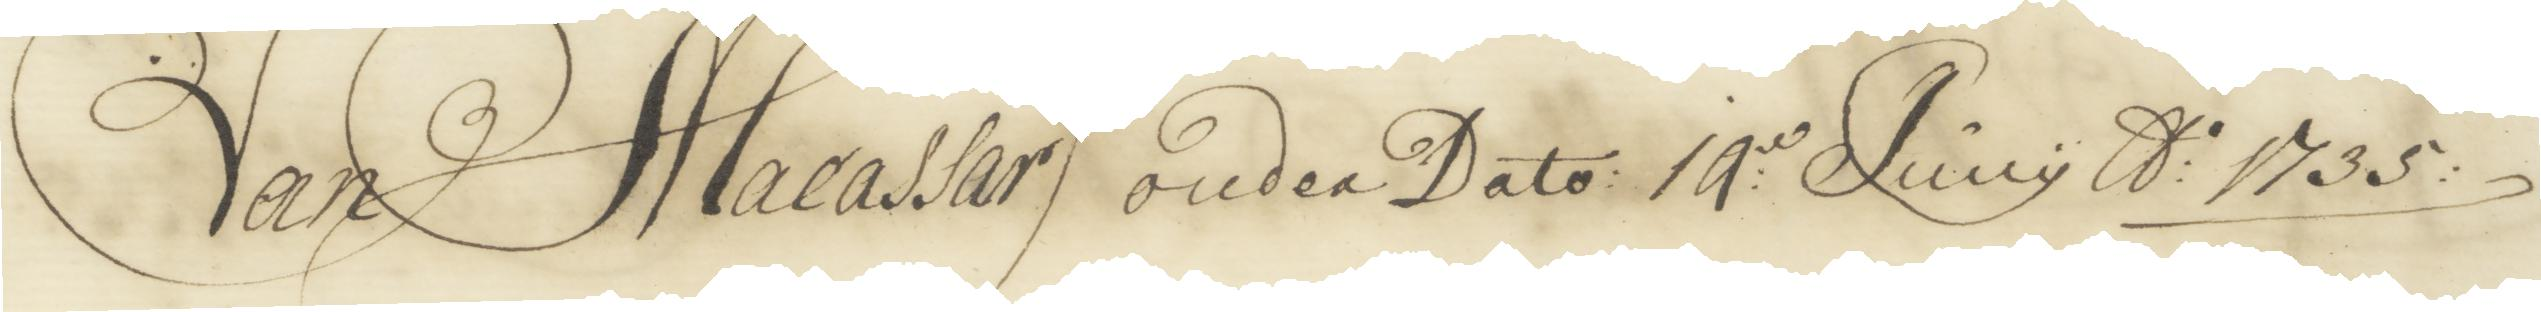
Van Macassar onder Dato: 14:e Iunij A:o 1735: —
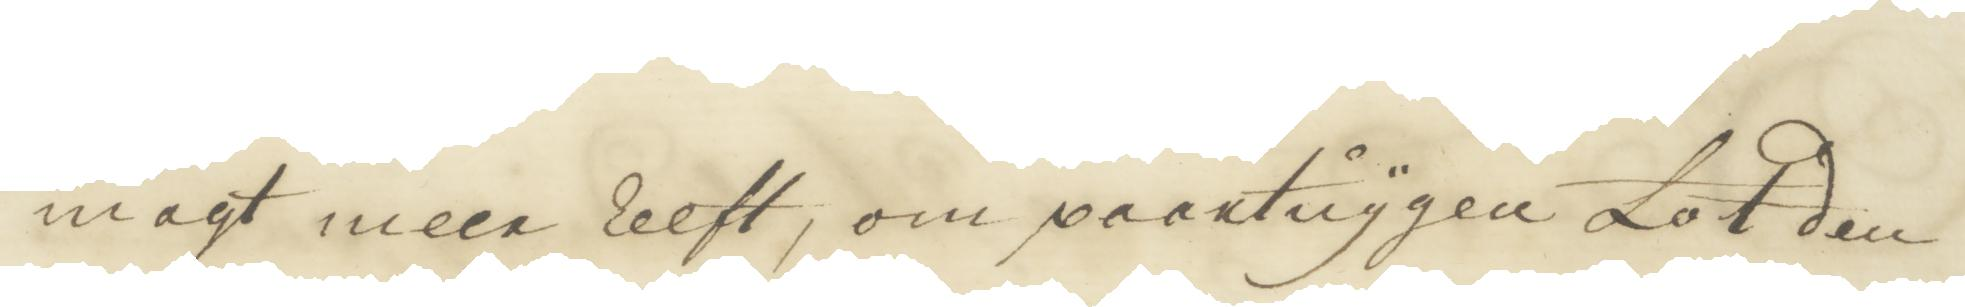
magt meer heeft, om vaartuijgen tot den
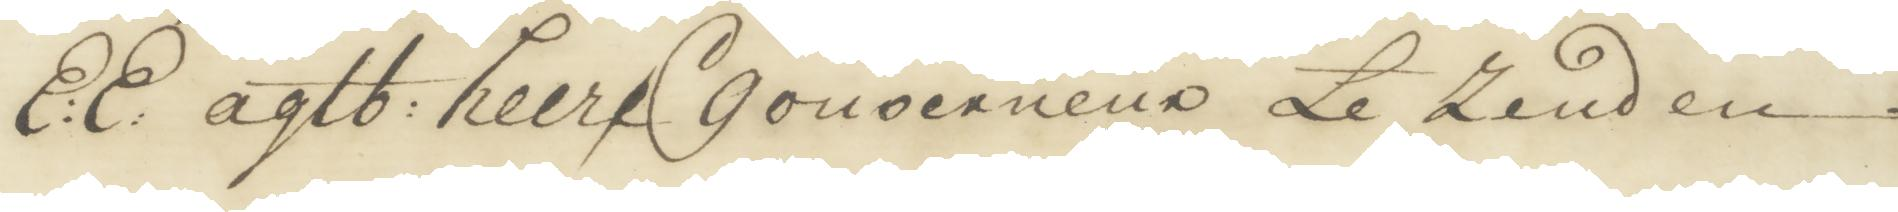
E:E: agtb: heere gouverneur te zenden
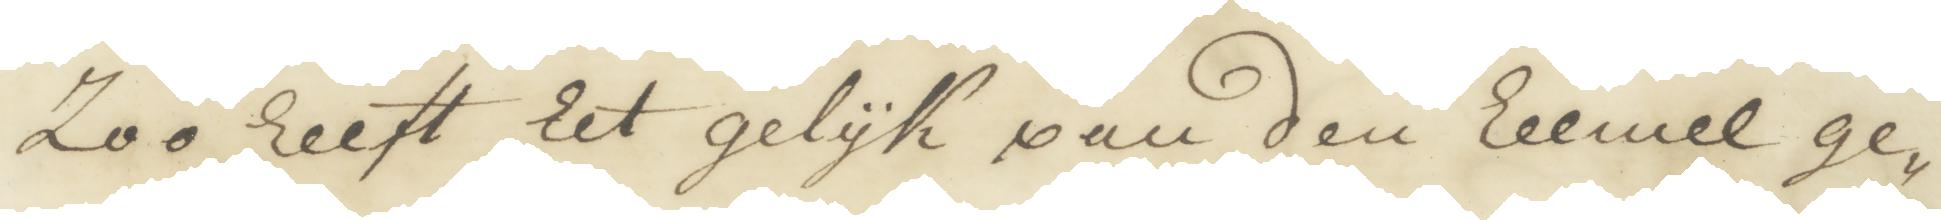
zoo heeft het gelijk van den heemel ge„
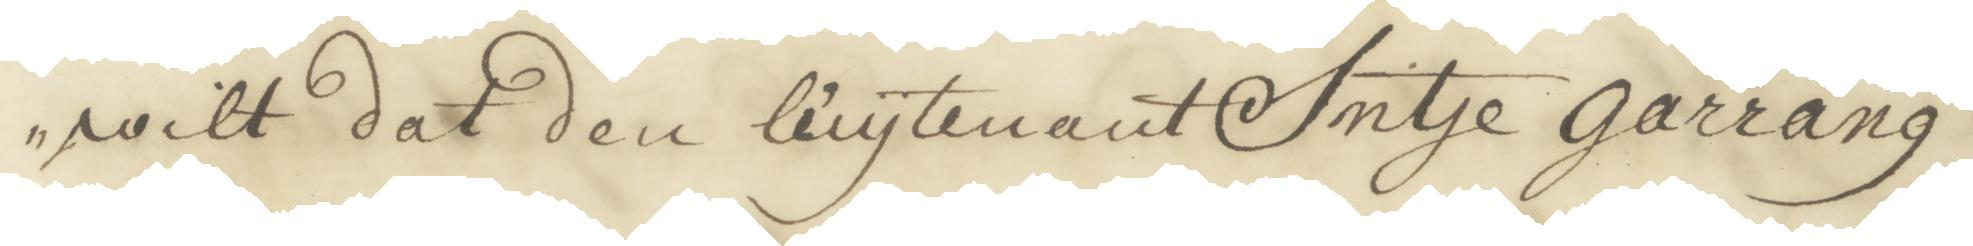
„wilt dat den luijtenant Intje garrang
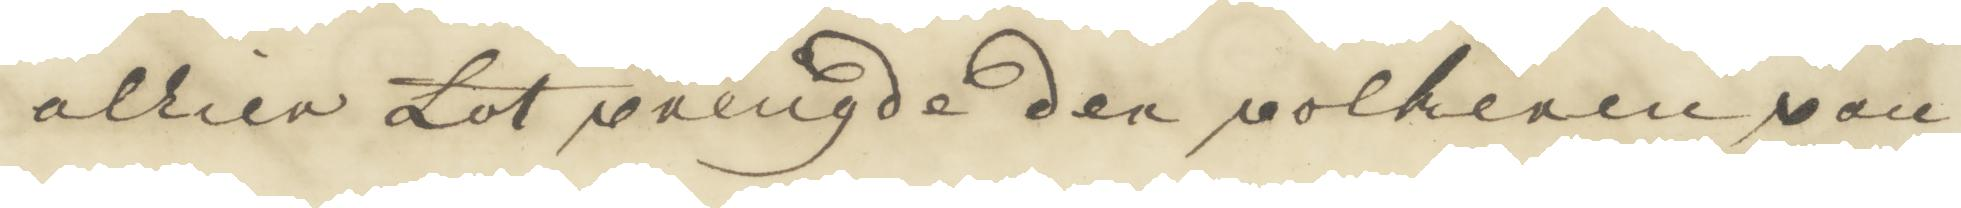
alhier tot vreugde der volkeren van
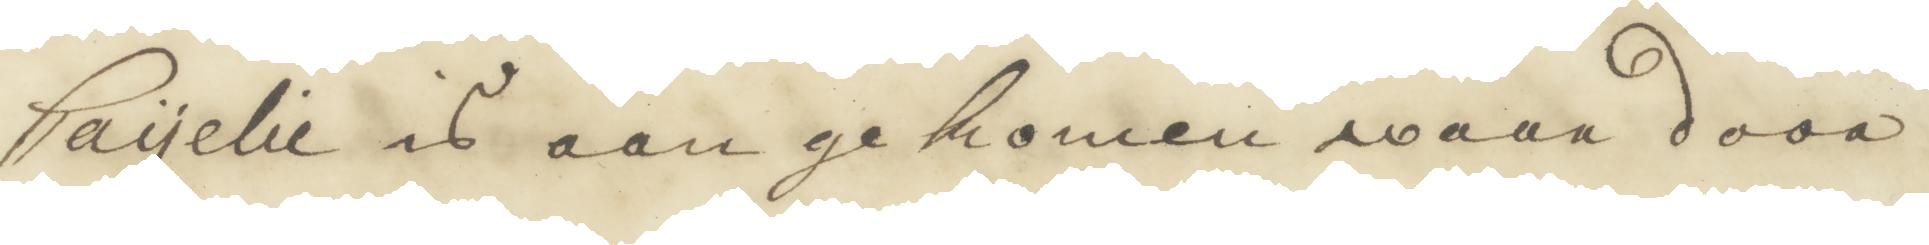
Caijelie is aan gekomen waar door
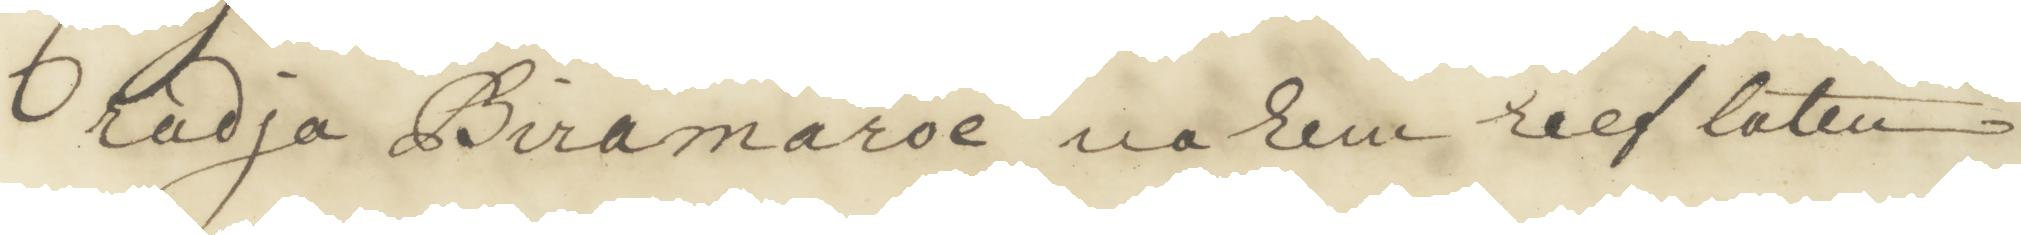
radja Biramaroe na hem heef laten
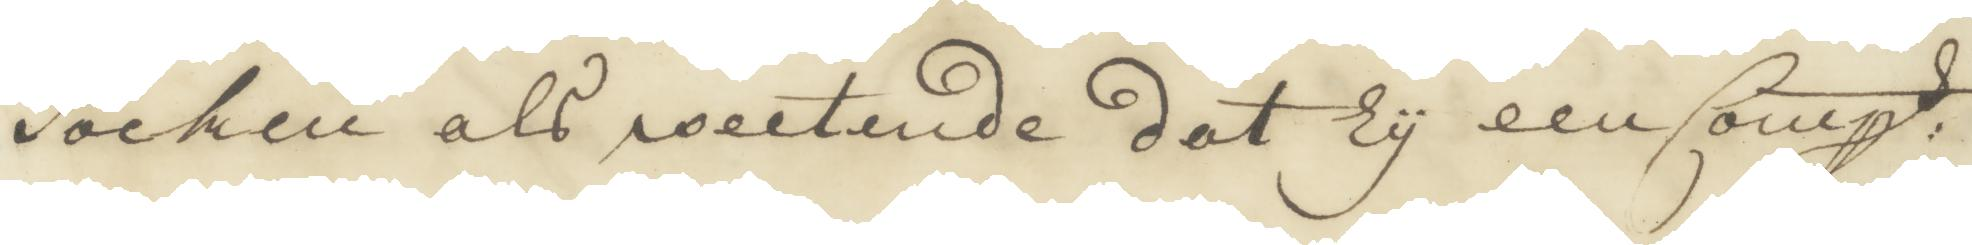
soeken als weetende dat hij een Comp:s
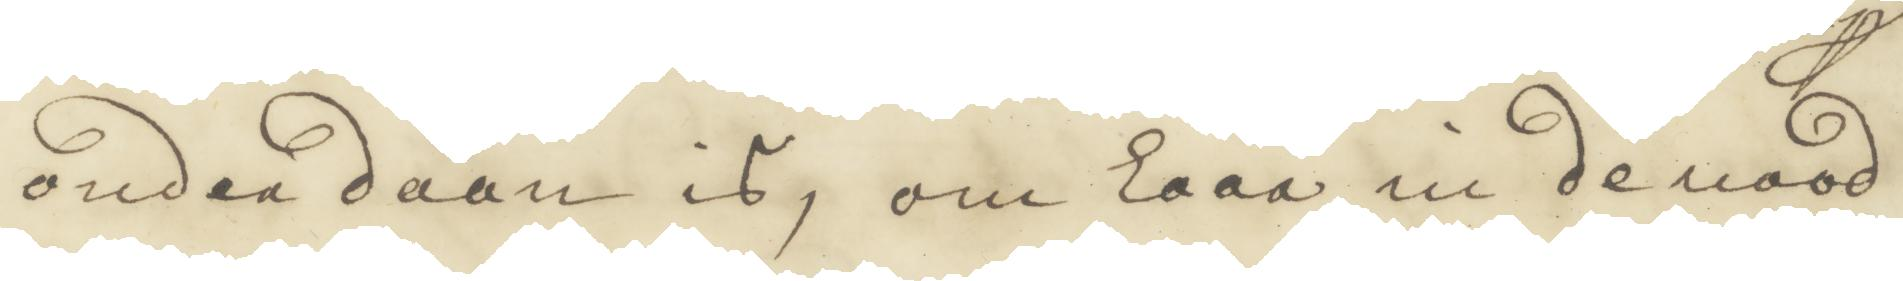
onder daan is, om haar in de nood
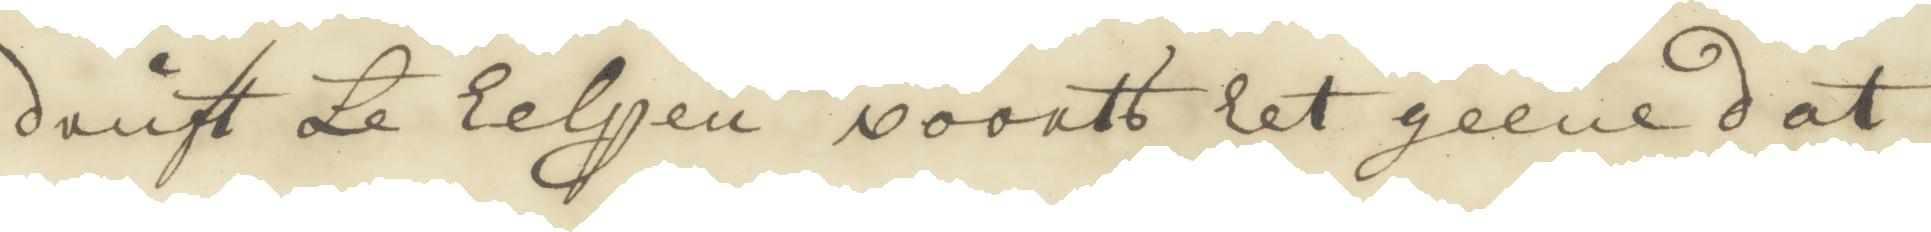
druft te helpen voorts het geene dat
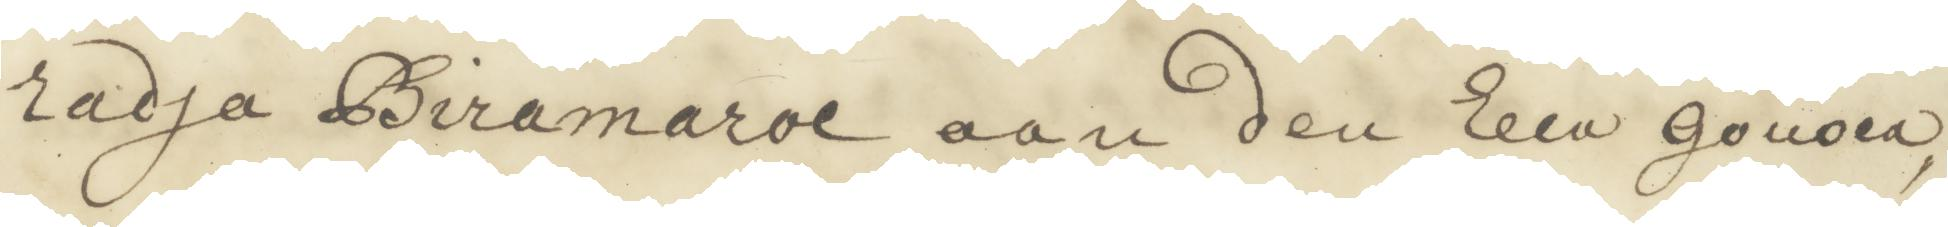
radja Biramaroe aan den heer gouver„
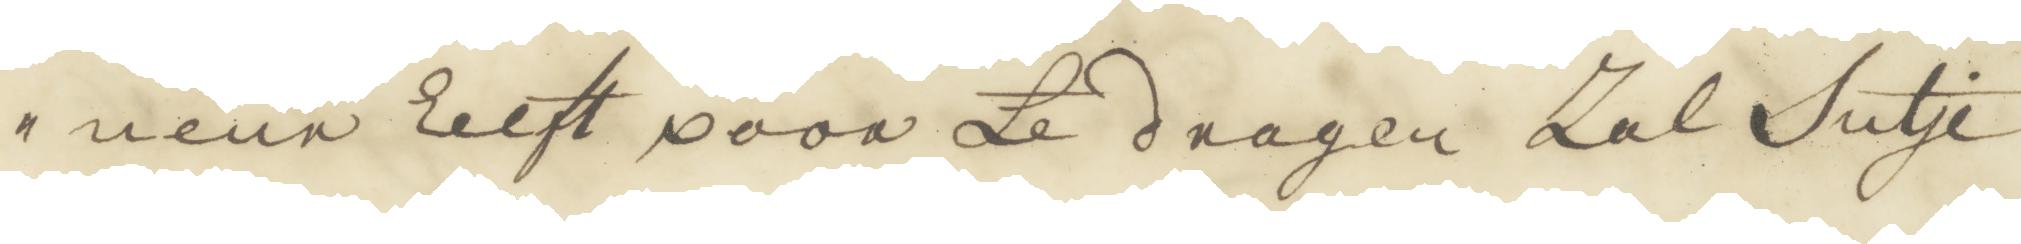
„neur heeft voor te dragen zal Intje
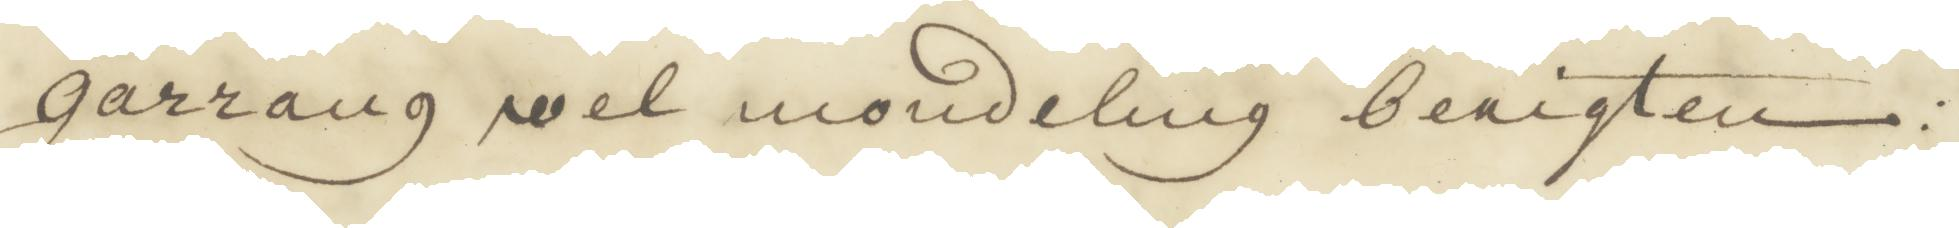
garrang wel mondeling berigten:
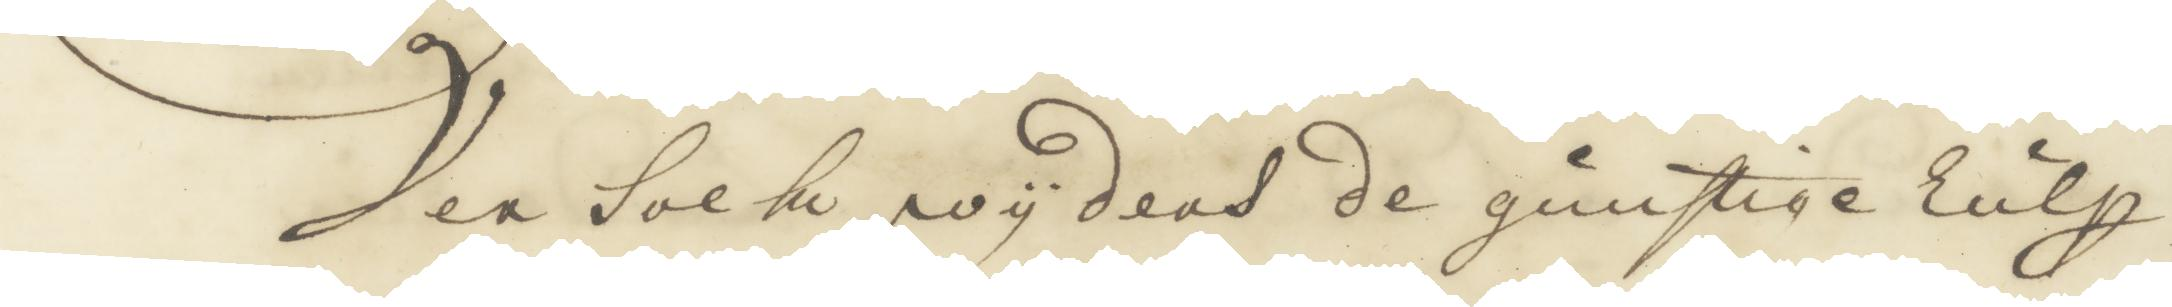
Versoek wijders de gunstige hulp
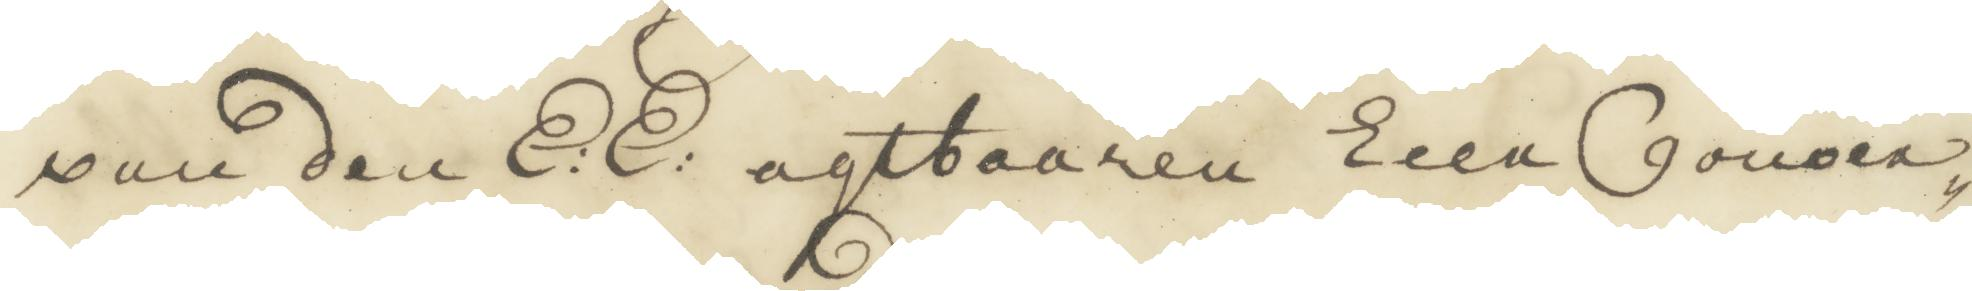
van den E:E: agtbaaren heer gouver„
